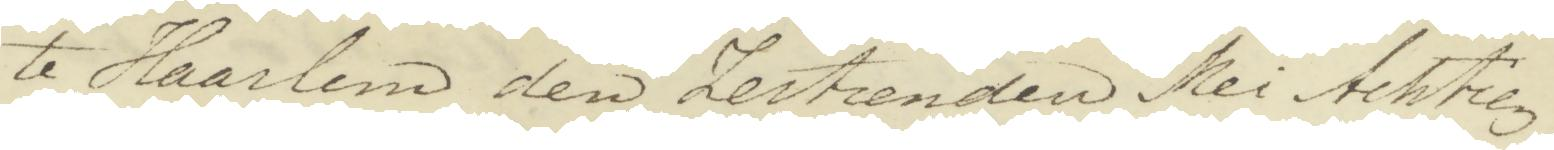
te Haarlem den Zestienden Mei Achtien
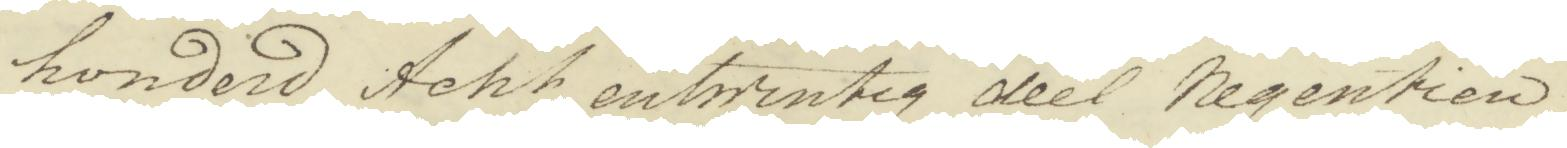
honderd Acht en twintig deel Negentien
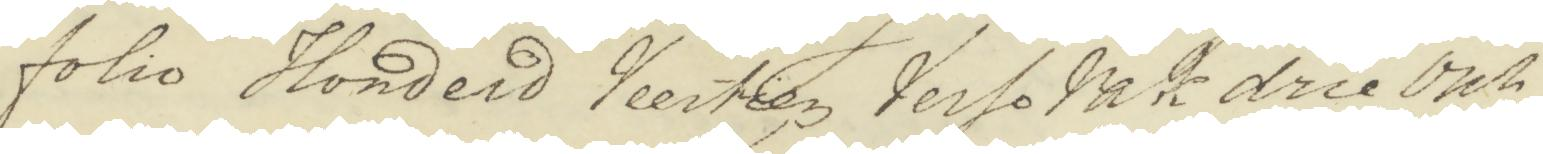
folio Honderd Veertien Verso vak drie ont
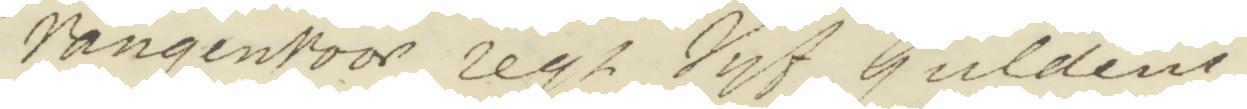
vangen voor regt Vyf guldens.
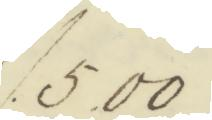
ƒ5.00
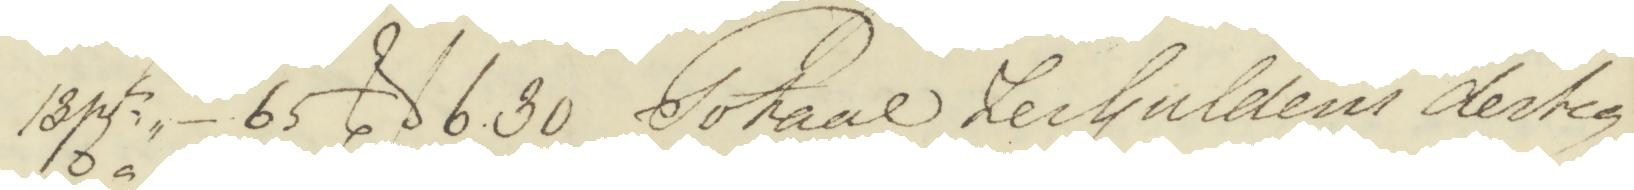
13 /c=t „ — .65 ƒ6.30 Totaal Zes Guldens dertig
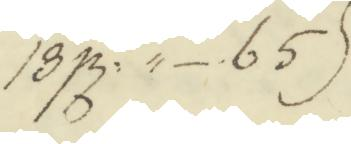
13 /c=t „ — .65
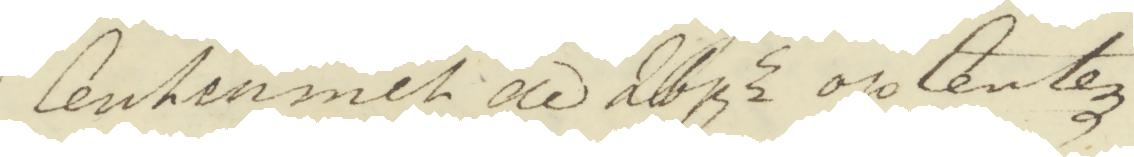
Centen met de 26/c=t op Centen
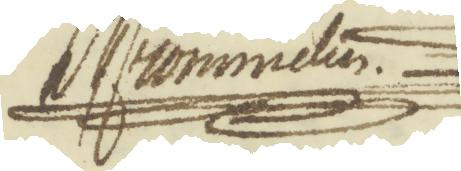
DFCrommelin —
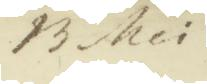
13 Mei
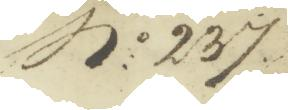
N:o 237.
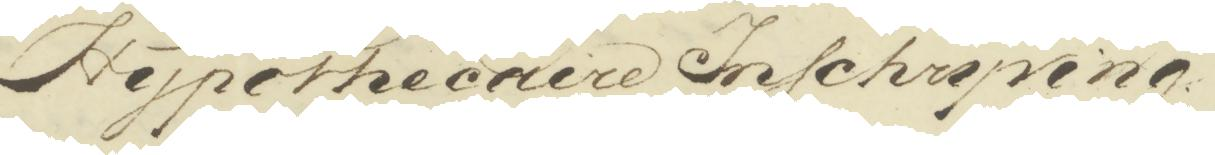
Hypothecaire Inschryving.
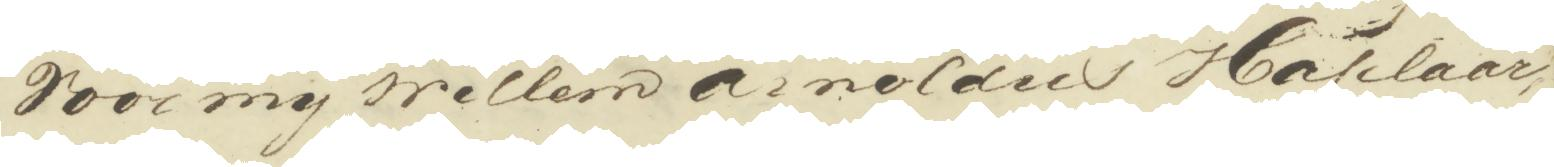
Voor my willem arnoldus Haselaar,
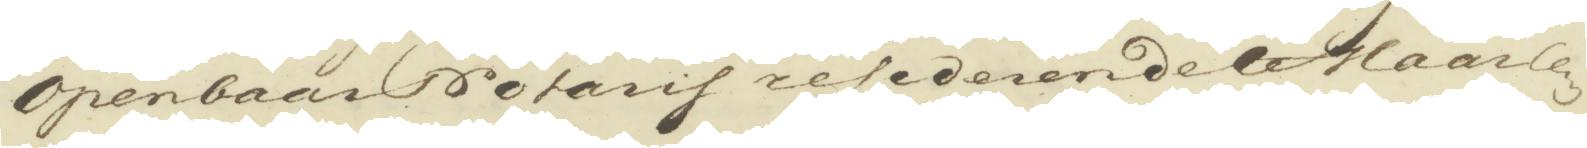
openbaar Notaris residerende te Haarlem
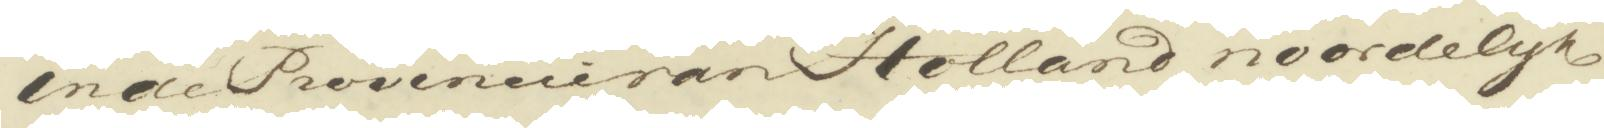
in de Provincie van Holland noordelyk
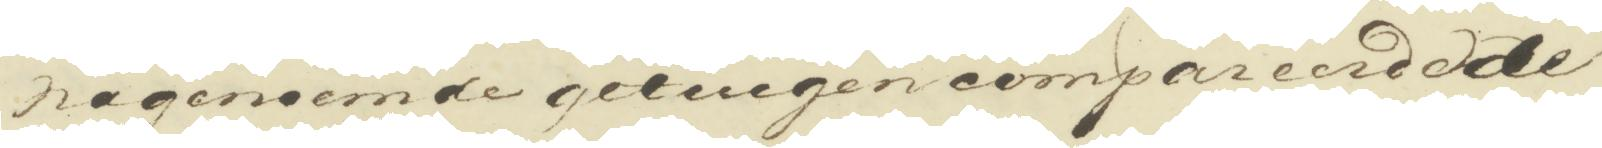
nagenoemde getuigen compareerde de
